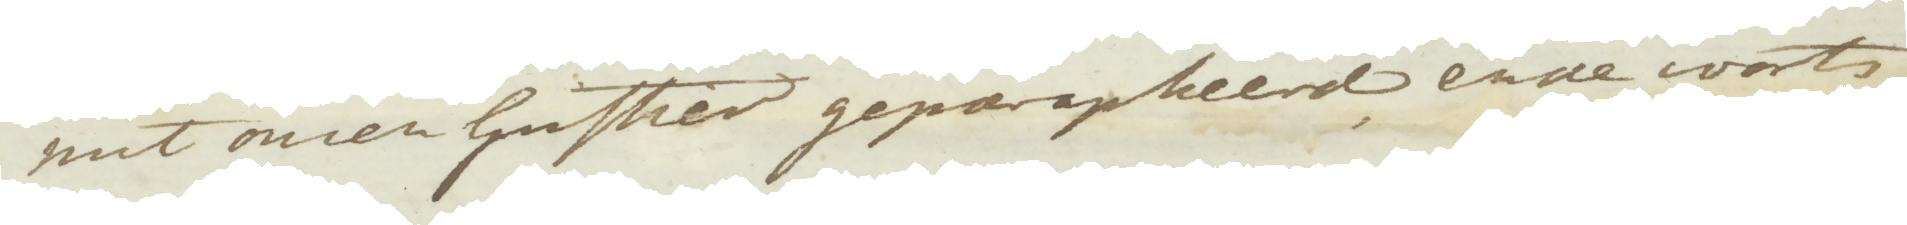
met onzen Griffier geparapheerd ende voorts
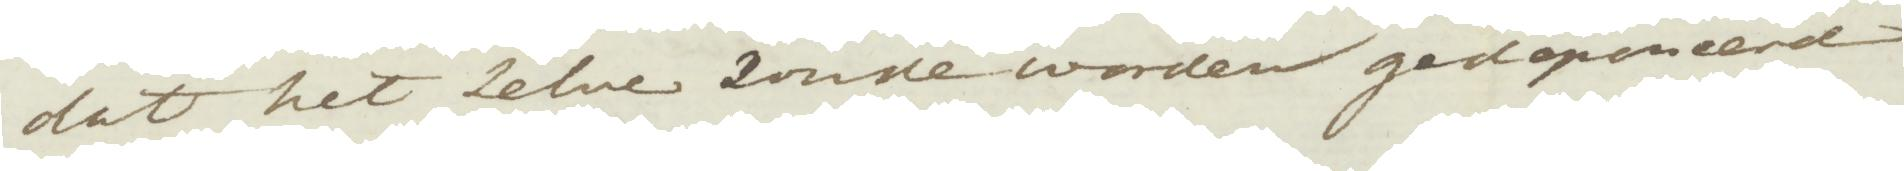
dat het zelve zoude worden gedeponeerd
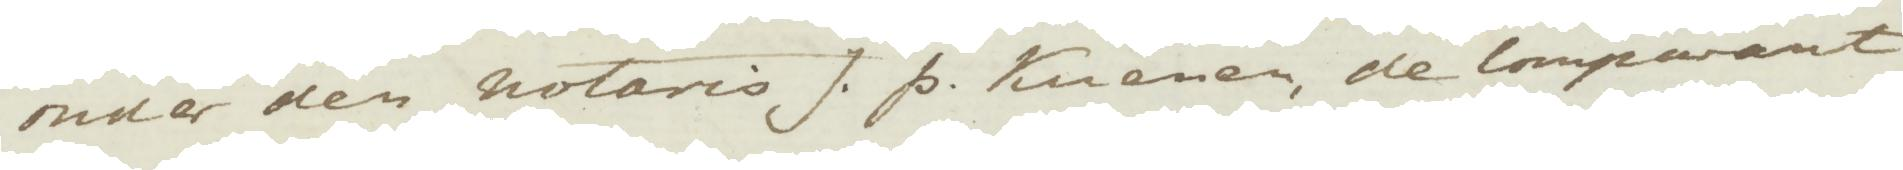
onder den notaris J. P. Kuenen, de comparant
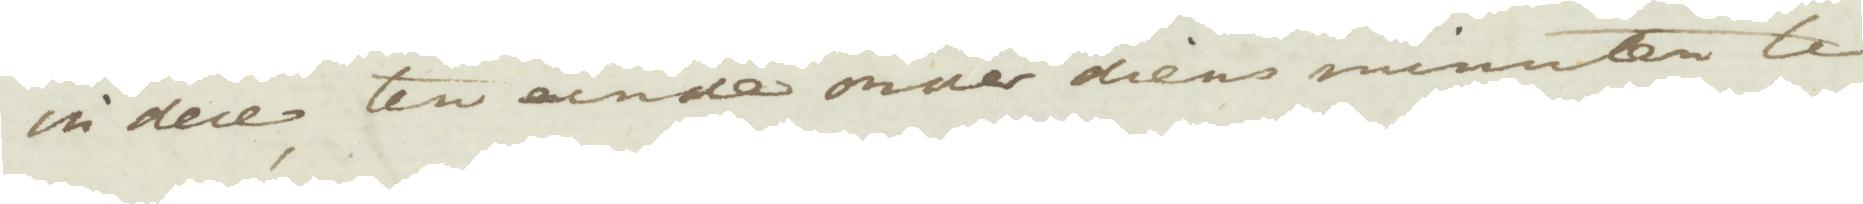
in deze, ten einde onder diens minuten te
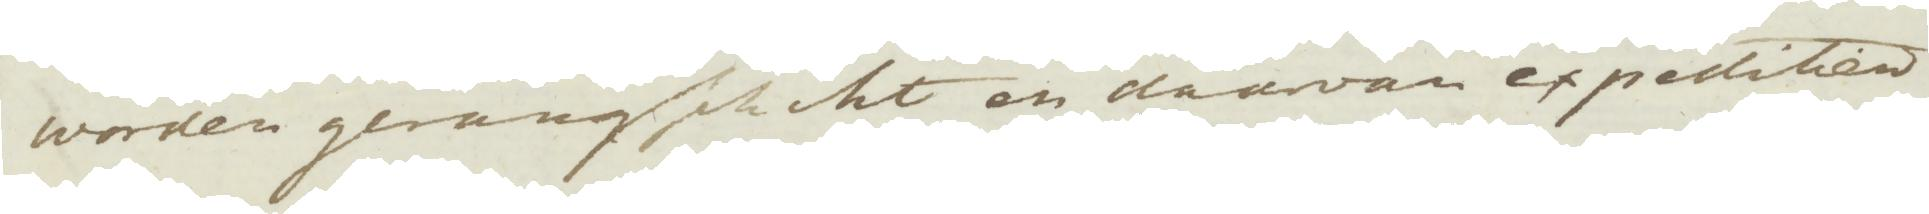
worden gerangschikt, en daarvan expeditien
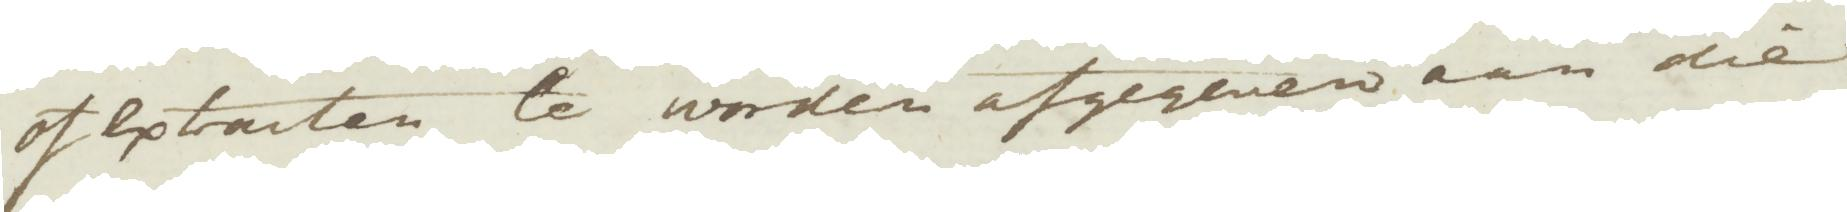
of extracten te worden afgegeven aan die
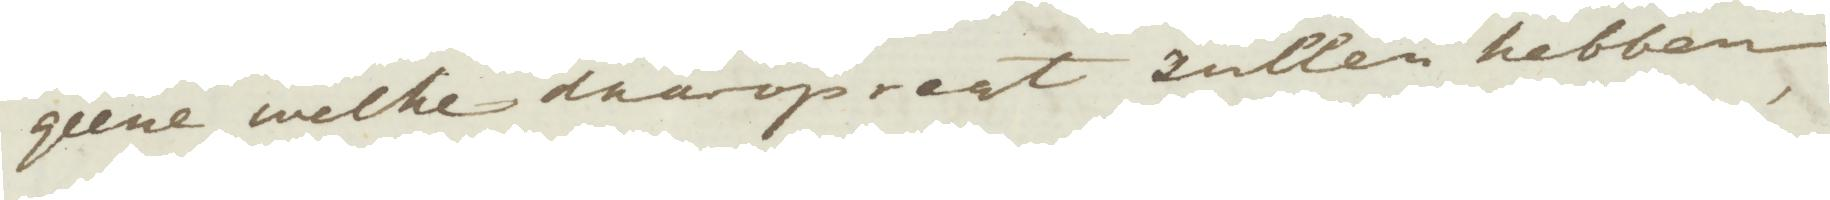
geene welke daarop regt zullen hebben,
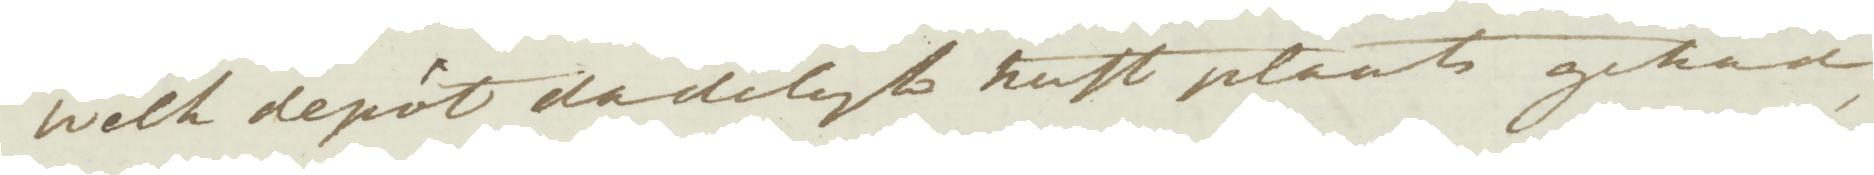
welk depot dadelyk heeft plaats gehad,
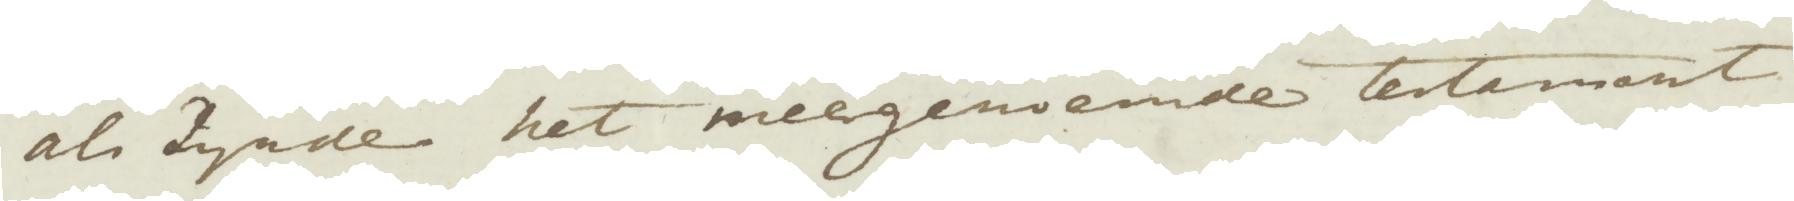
als zynde het meergenoemde testament
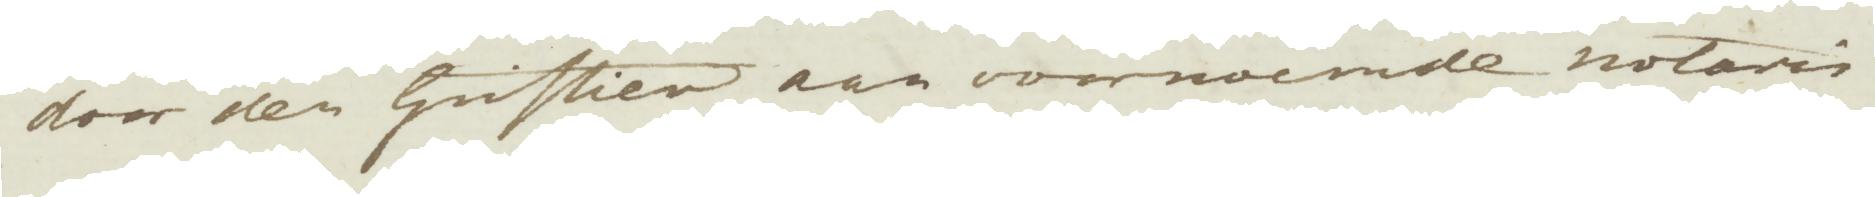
door den Griftier aan voornoemde notaris
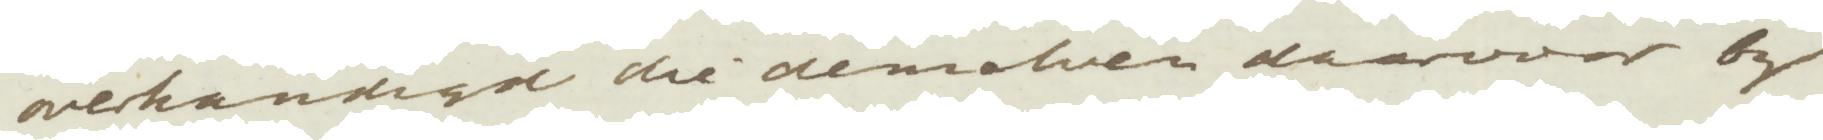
overhandigd, die de maker daarvoor by
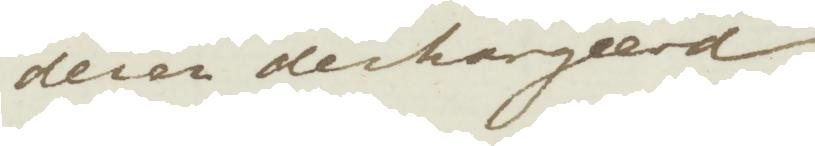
dezen dechargeerd
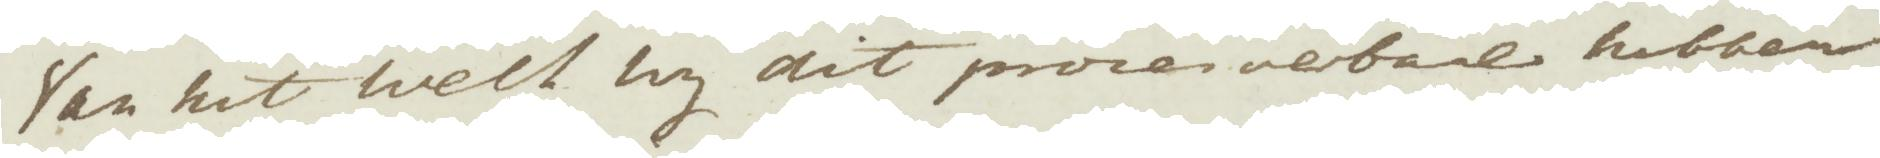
Van het welk wy dit procesverbaal hebben
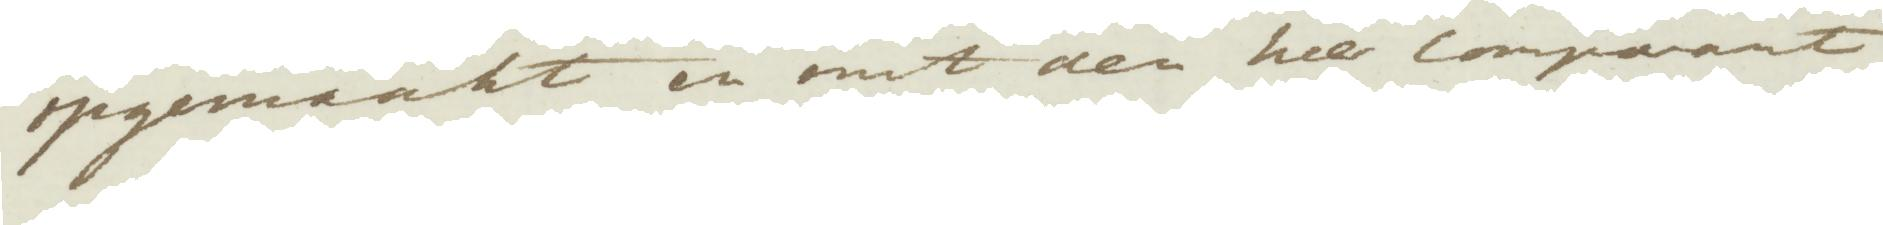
opgemaakt, en met den heer Comparant
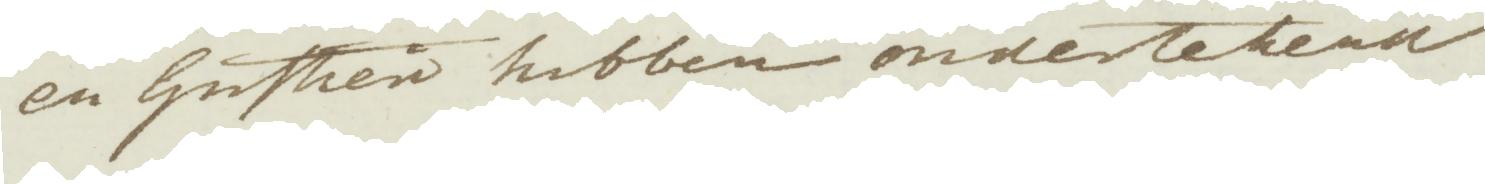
en Griffier hebben ondertekend
